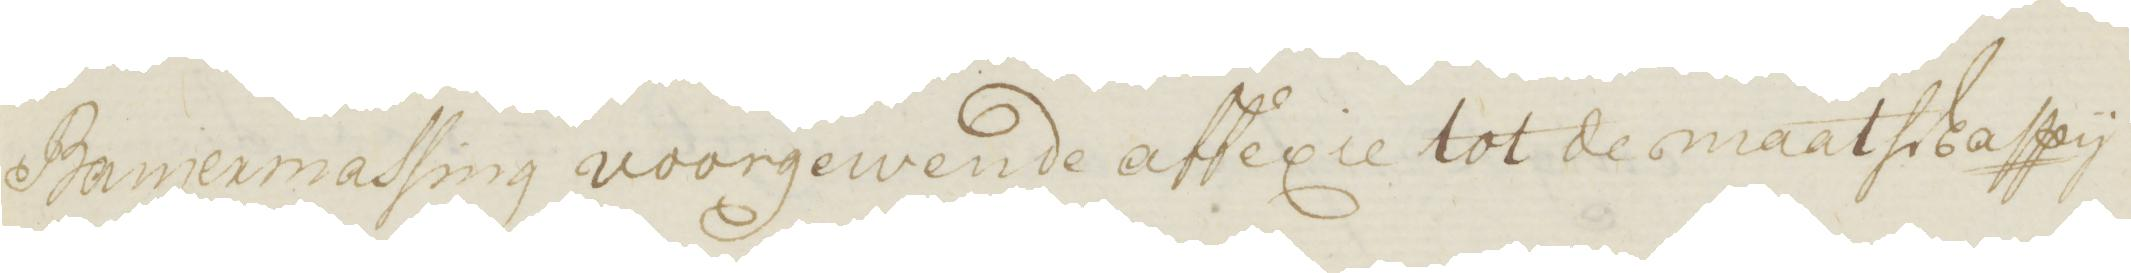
Banjermassing voorgewende affexie tot de maatschappij
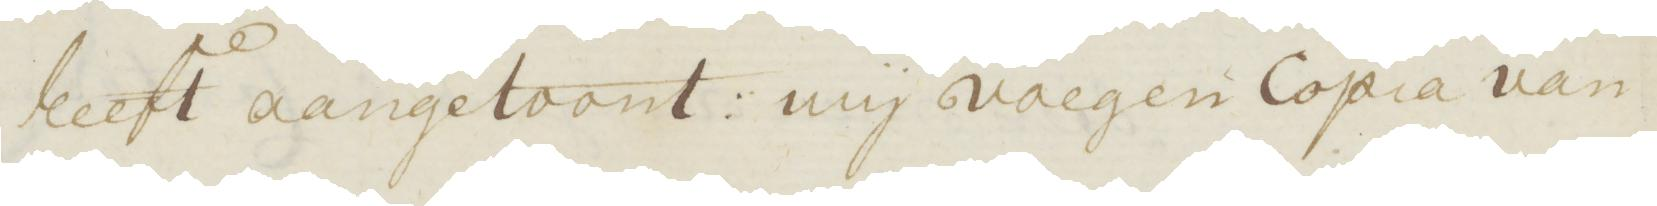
heeft aangetoont: wij voegen copia van
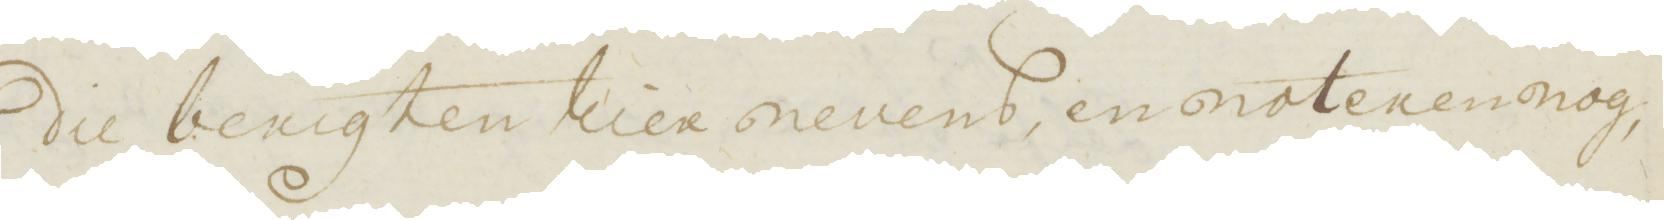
die berigten hier nevens en noteren nog,
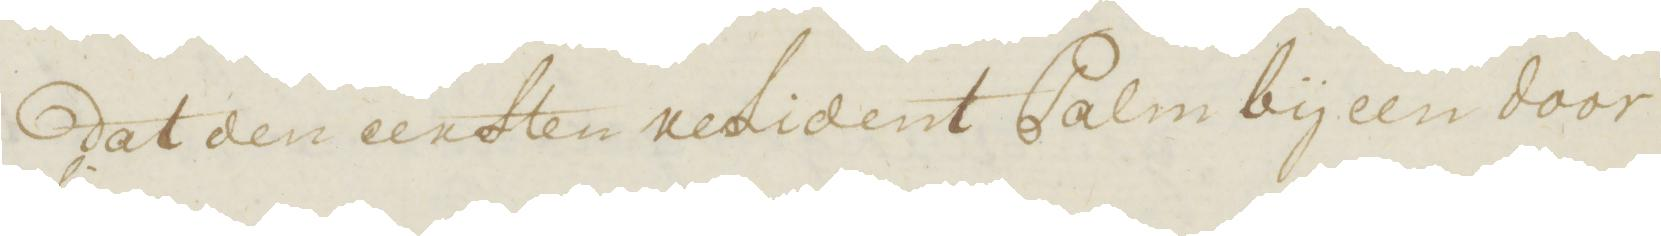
dat den eersten resident Palm bij een door
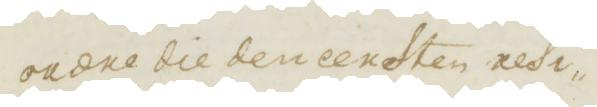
ordre die den eersten resi„
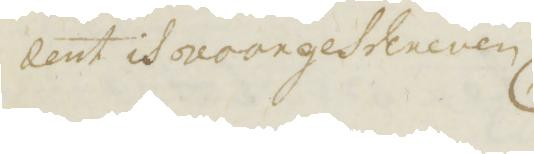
dent is voorgeschreven
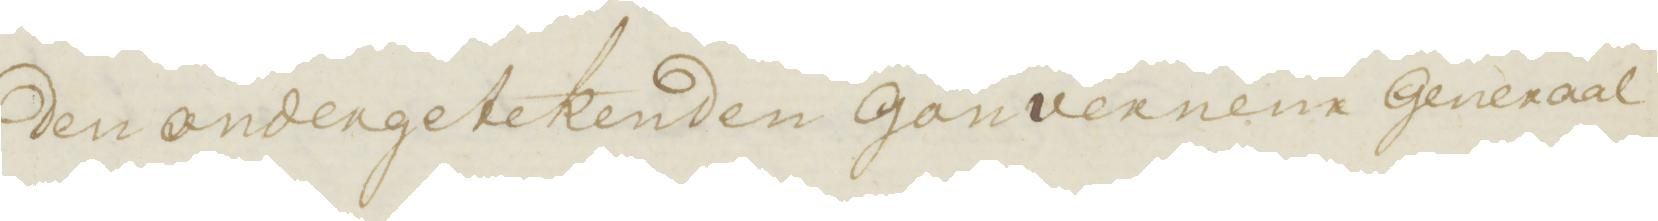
den ondergetekenden Gouverneur Generaal
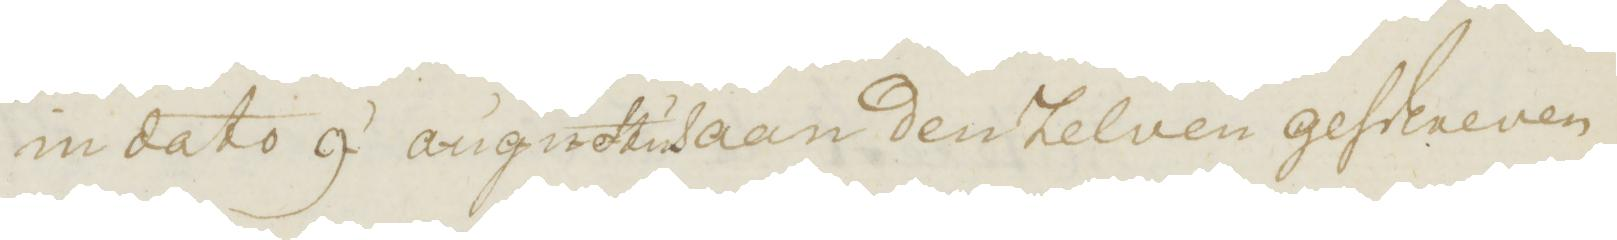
in dato 9’ augustus aan den zelven geschreven
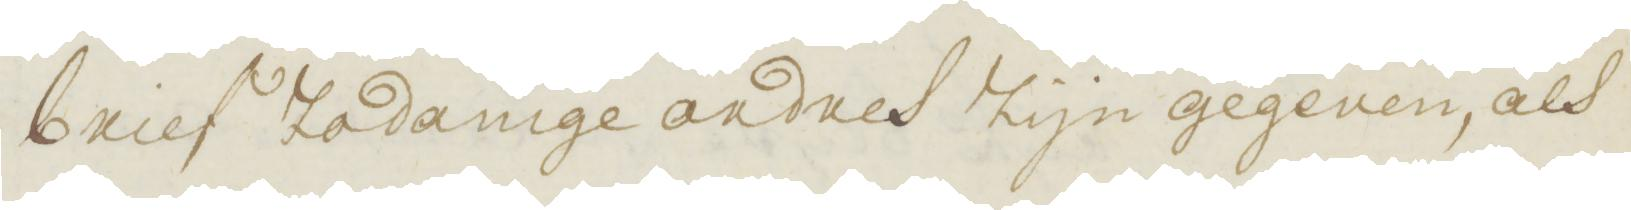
brief zodanige ordres zijn gegeven, als
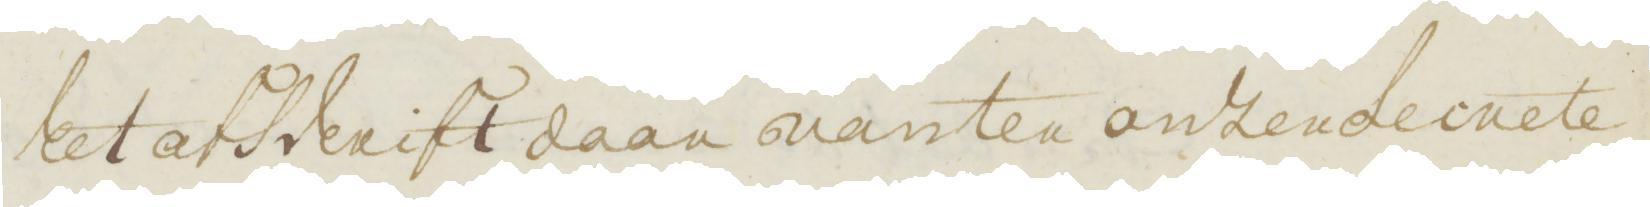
het afschrift daar van ter onzer secrete
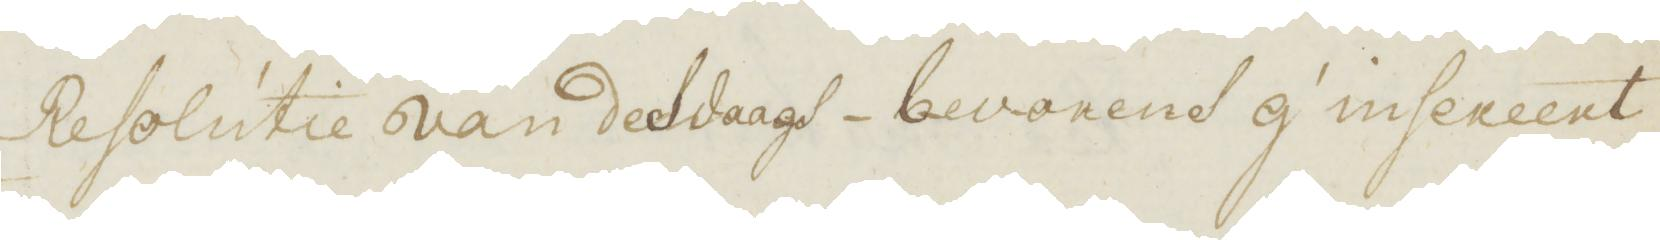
Resolutie van deesdaags-bevorens g’insereert
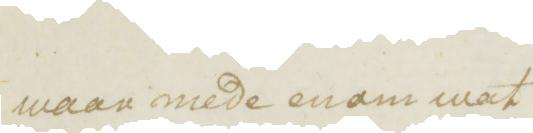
waar mede en om wat
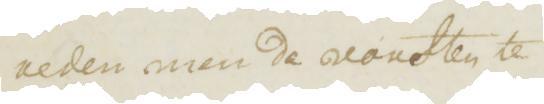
reden men de vorsten te
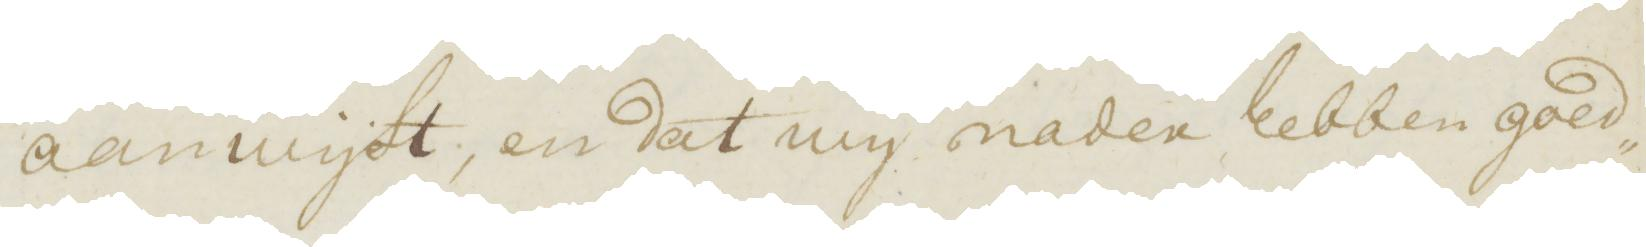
aanwijst, en dat wij nader hebben goed„
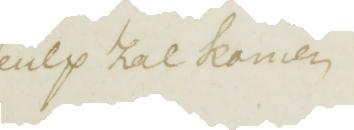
hulp zal komen
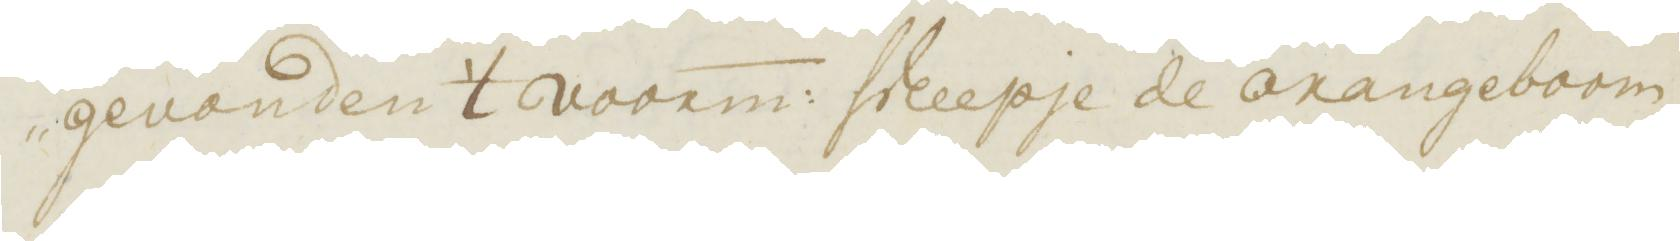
„gevonden ’t voorm: scheepje de Orangeboom
